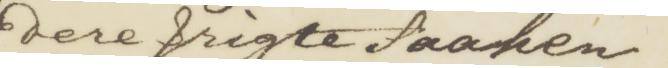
dere verrigte saaken
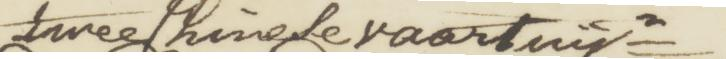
twee Chinese vaartuij=n
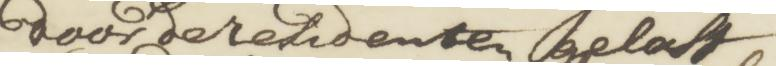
door deresidenten gelast
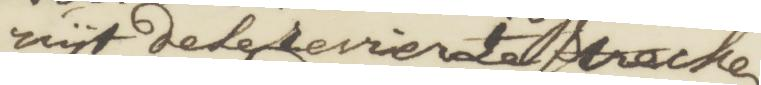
uijt deserevier te vertrecken
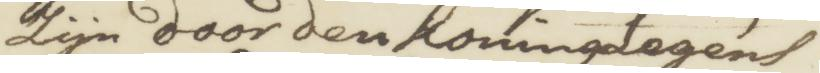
zijn door den koningtegens
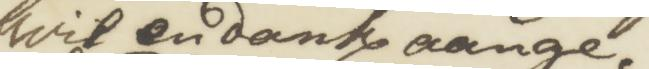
wil en dank aange„
